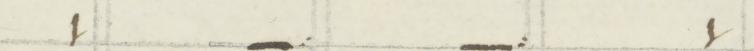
1 —: —: 1
